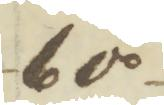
6 do
